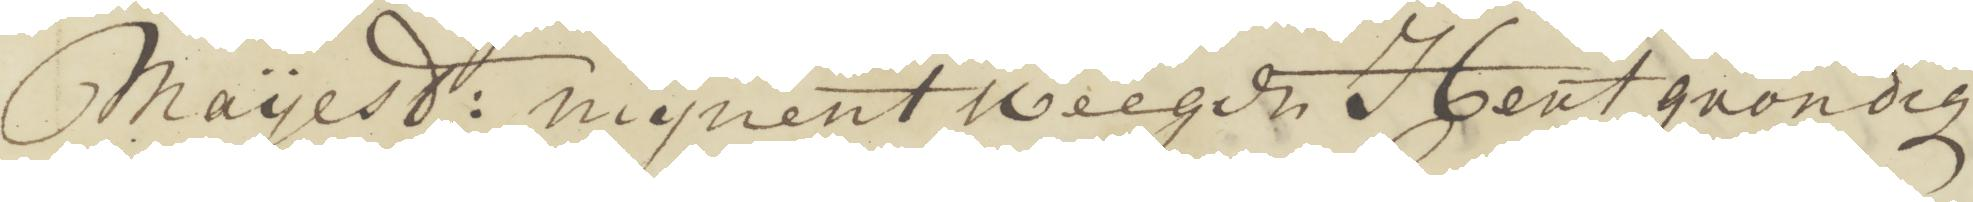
Maijest: mijnent weegen Hertgrondig
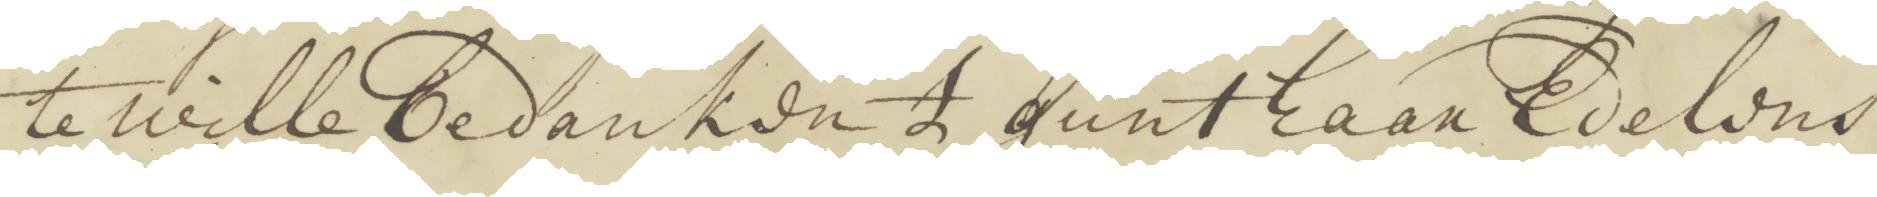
te wille bedanken 't gunt haar Edelens
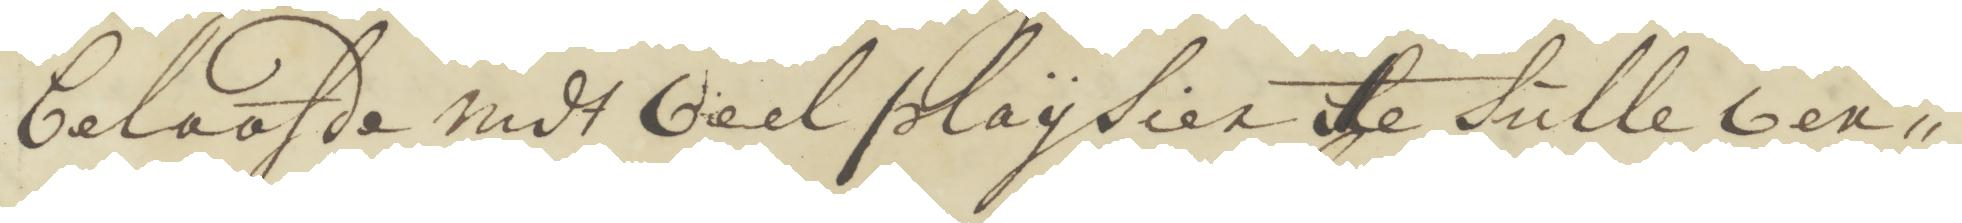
beloofde met veel plaijsier te sulle ver„
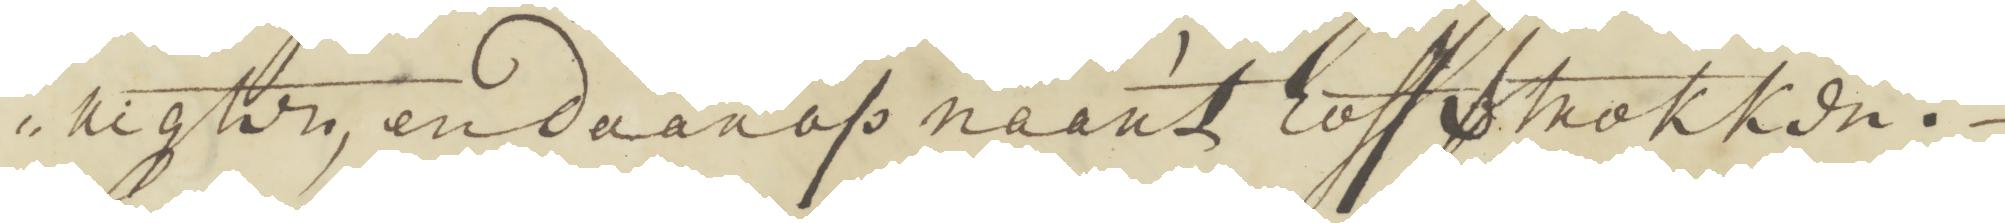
„rigten, en daarop naar't hoff vertrokken.-
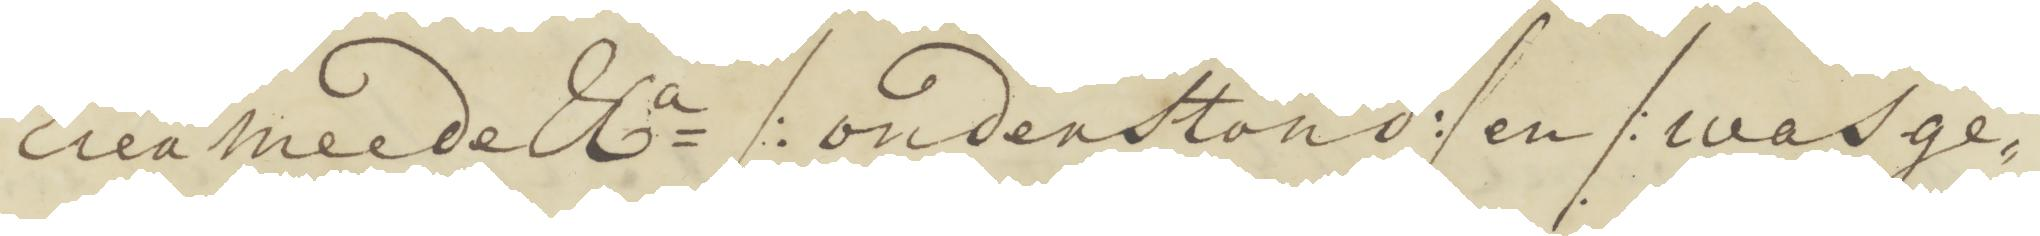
hier meede Etc=a /: onderstond:/ en /:was ge„
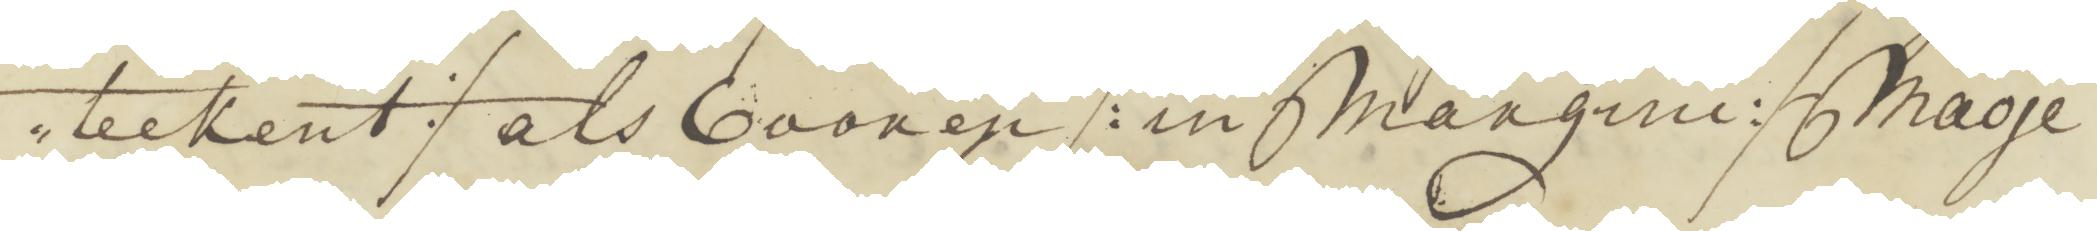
„teekent:/ als booven /:in Margine:/ Maoje
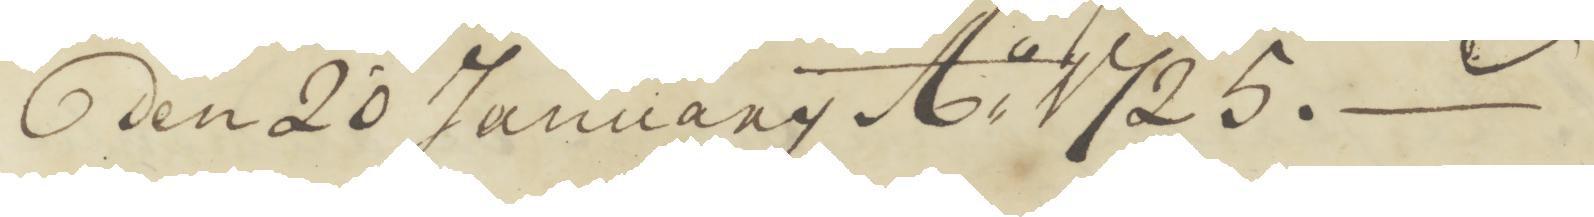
den 20' Januarij A„o 1725. —
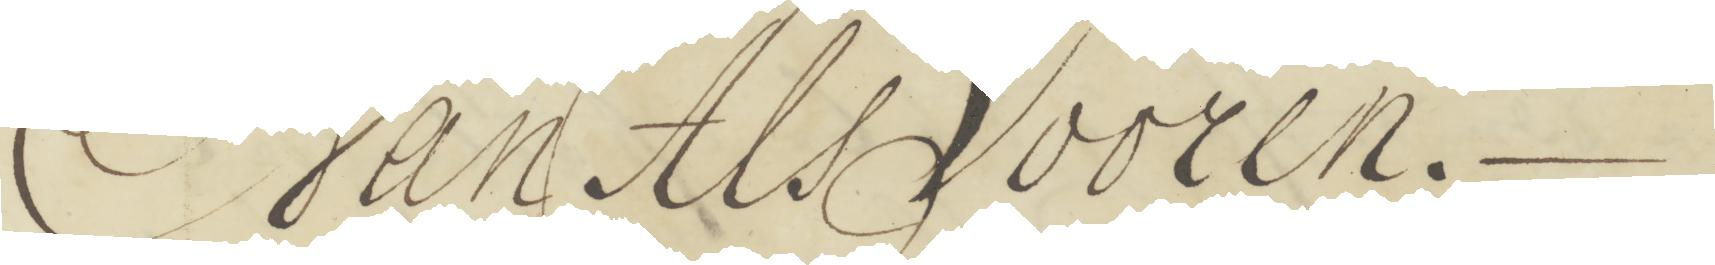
Van Als Vooren. —
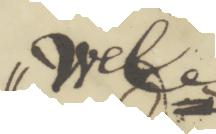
„Wel
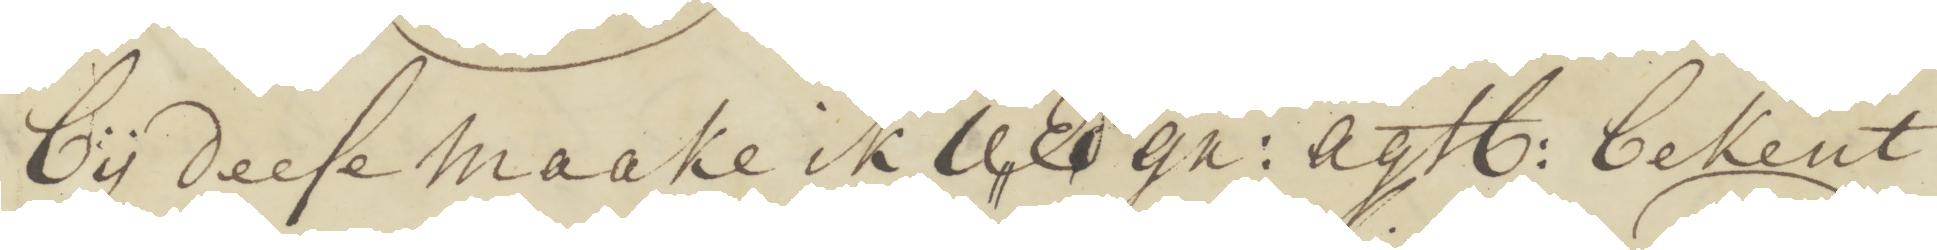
bij deese maake ik u„ Ed=e gr: agtb: bekent
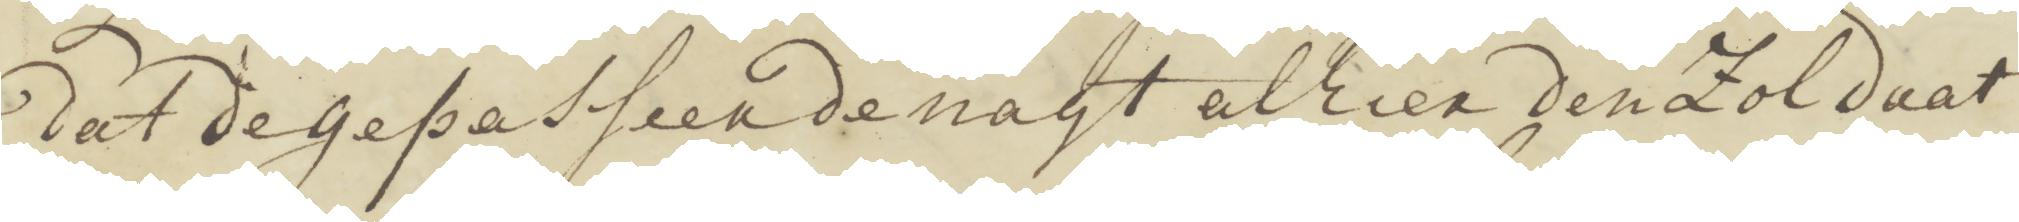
dat de gepasseerde nagt alhier den zoldaat
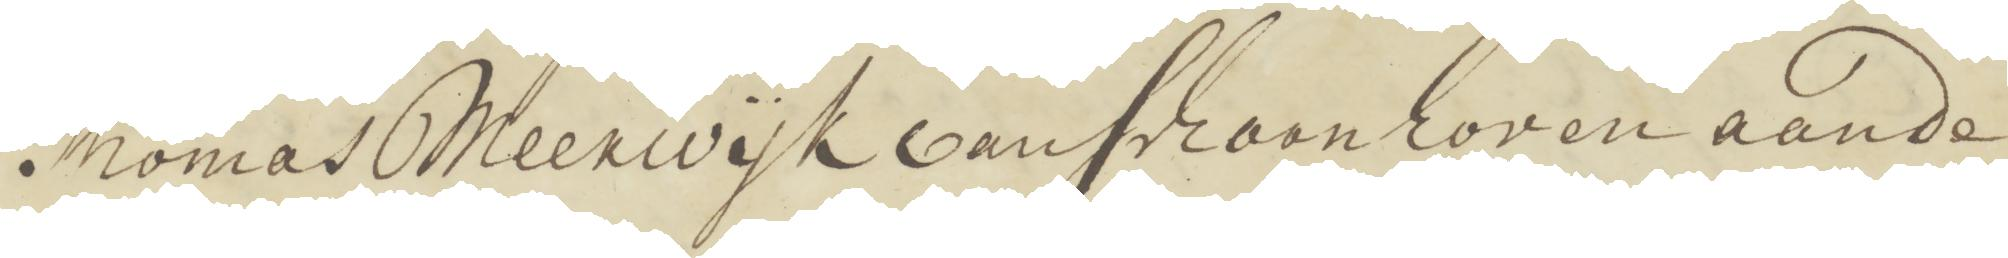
Thomas Meerwijk van Schoonhoven aan de
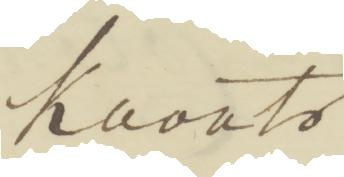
koorts
